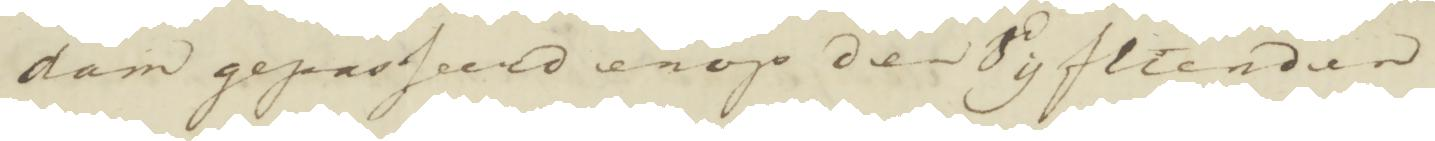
dam gepasseerd en op den Vijftienden
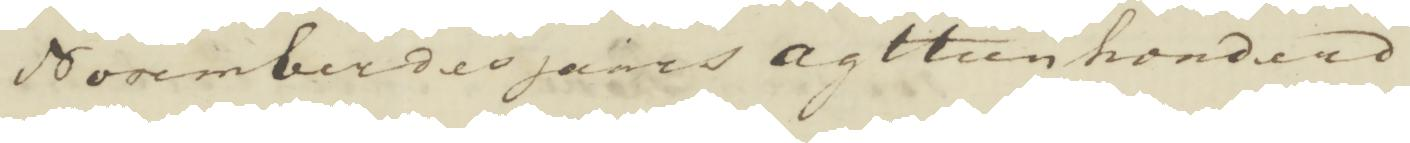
November des jaars agttien honderd
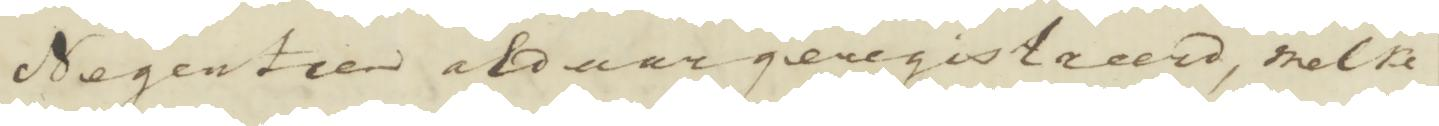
Negentien aldaar geregistreerd, welke
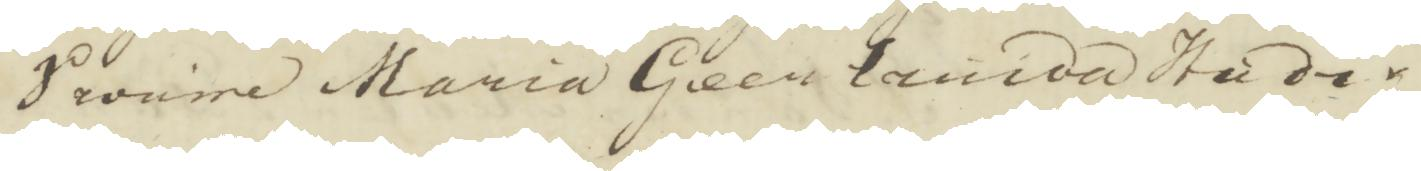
Vrouwe Maria Geer truida Hudig
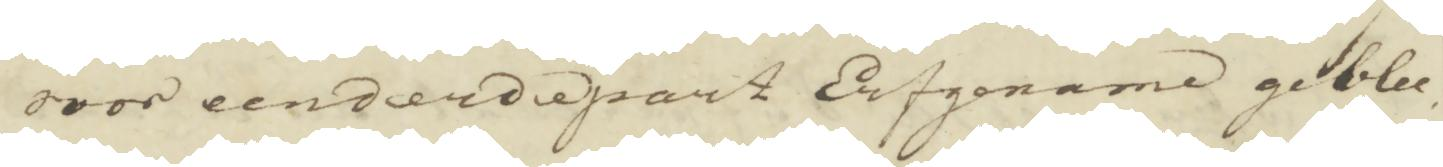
voor een derde part Erfgename geblee„
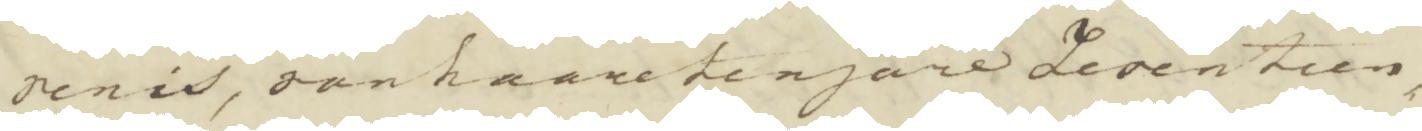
venis, van haare ten jare zeventien„
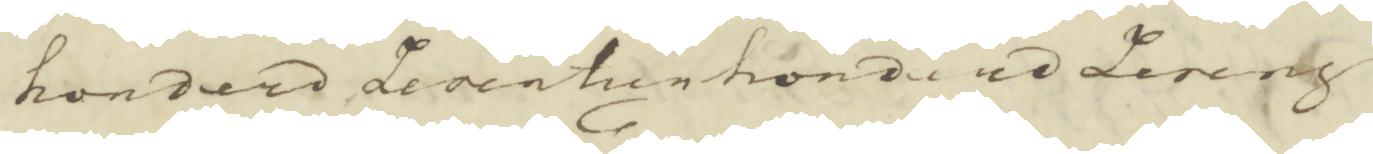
honderd zeventien honderd zevenen
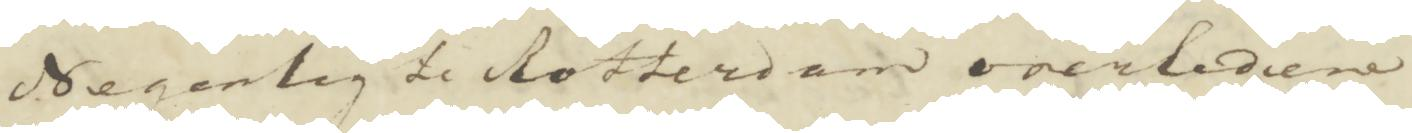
Negentig te Rotterdam overledene
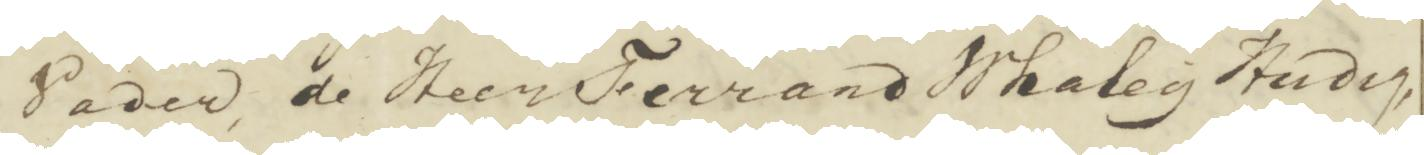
Vader, de Heer Ferrand Whaley Hudig,
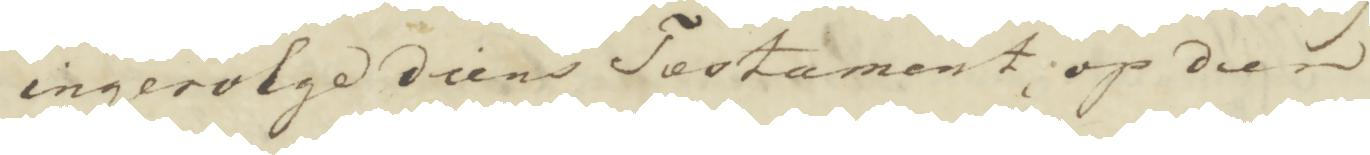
ingevolge diens Testament, op dien
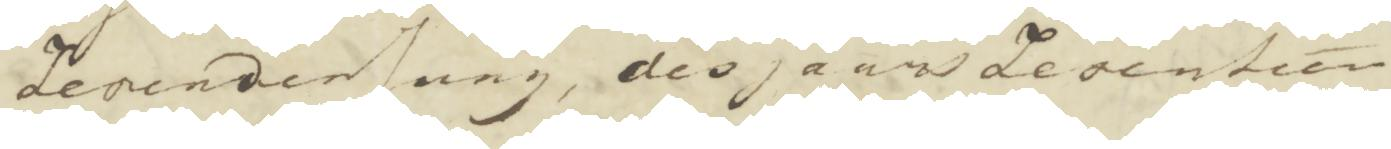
zevenden Juny, des jaars zeventien
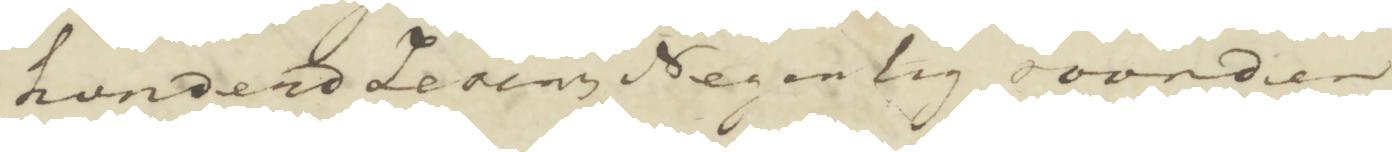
honderd zevenen Negentig voor den
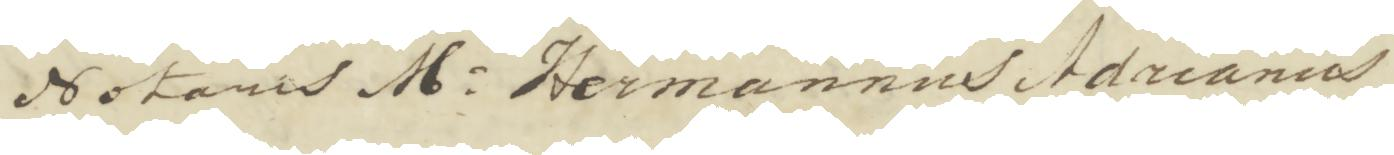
Notaris M: Hermannus Adrianus
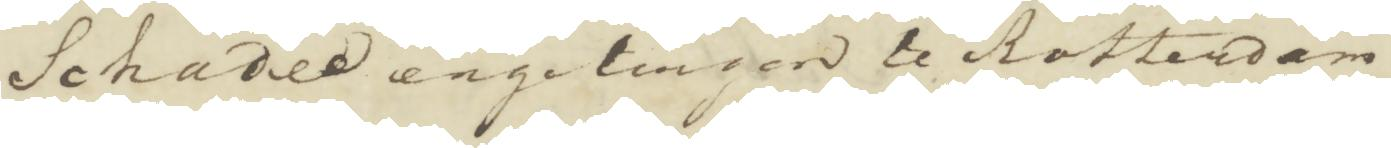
Schadee en getuigen te Rotterdam
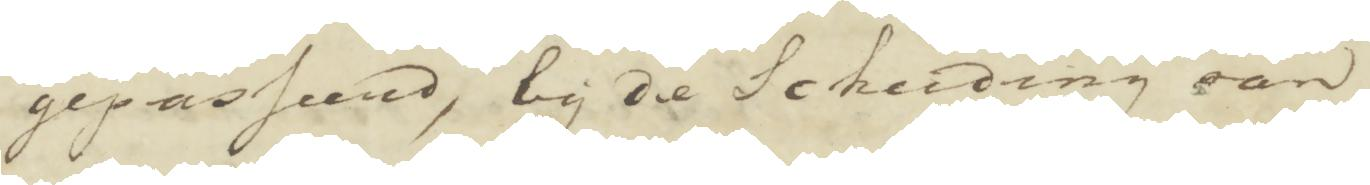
gepasseerd, bij de scheiding van
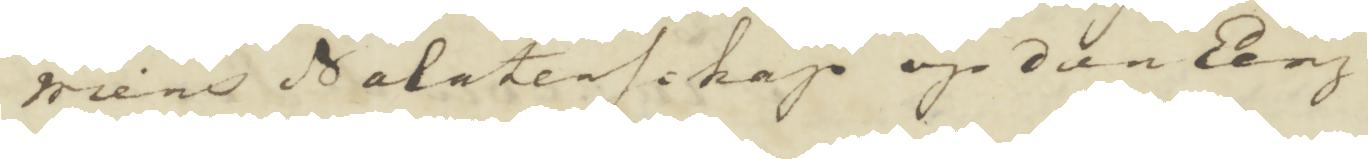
wiens Nalatenschap op den Eenen
